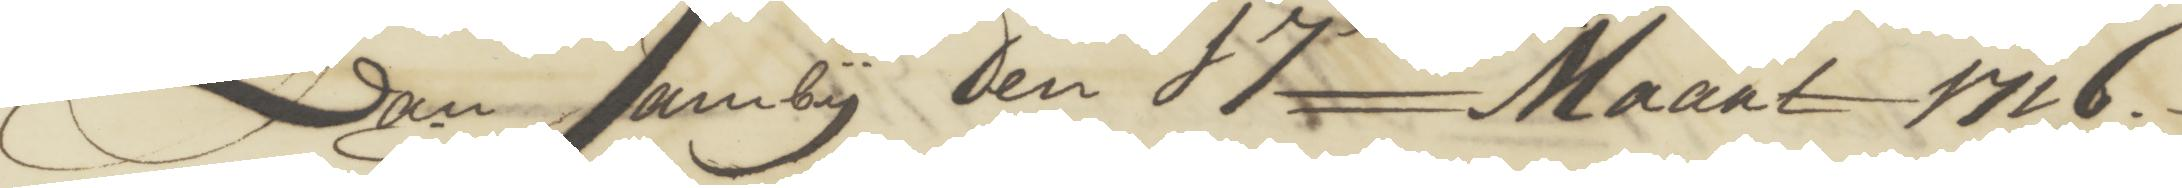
Van Jambij den 17=e Maart 1716.
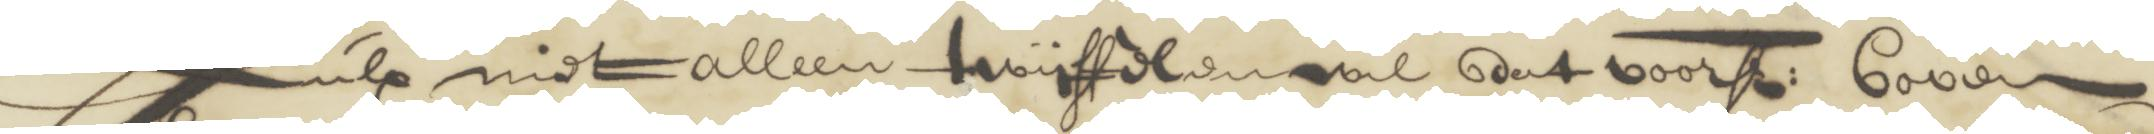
Zulx niet alleen twijffelen wil dat voorsz: boven
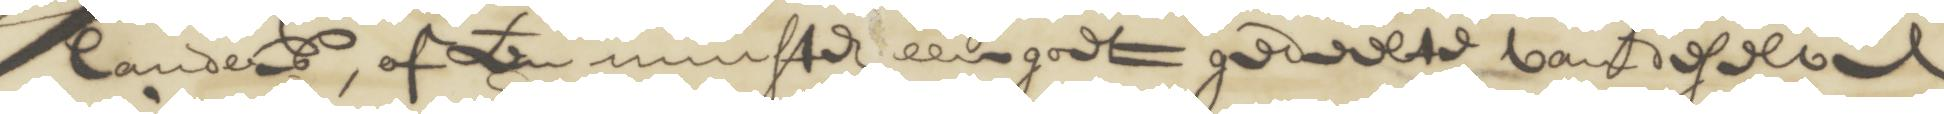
landers, of ten minsten een goet gedeelte van deselve
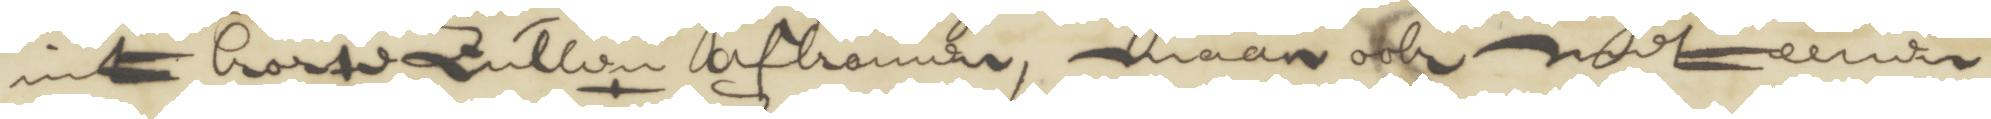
int korte Zullen afkomen, maar ook met eenen
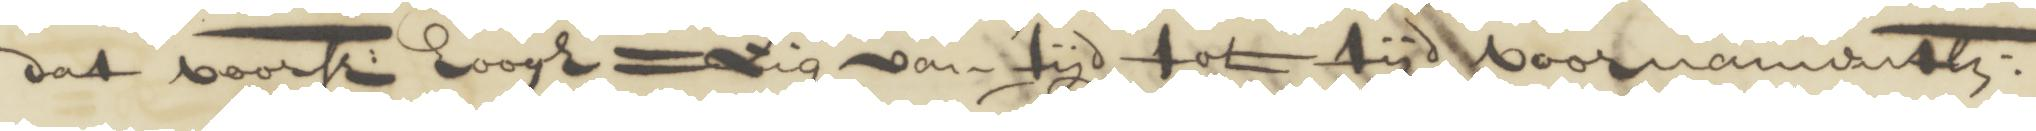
dat voorsz: hoogh=t Zig van tijd tot tijd voornamentlijk
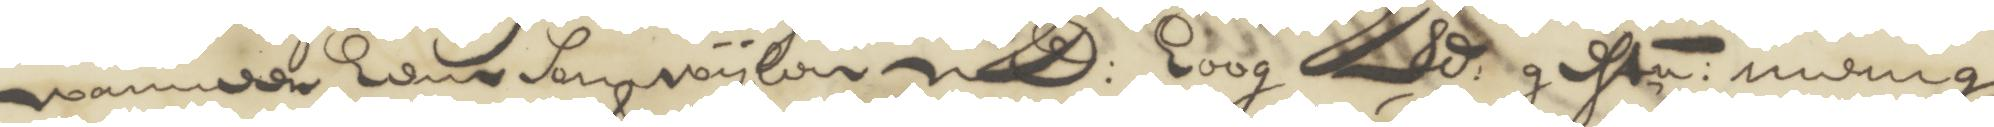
wanneer hem somwijlen uE: hoog Ed: gestr: menig
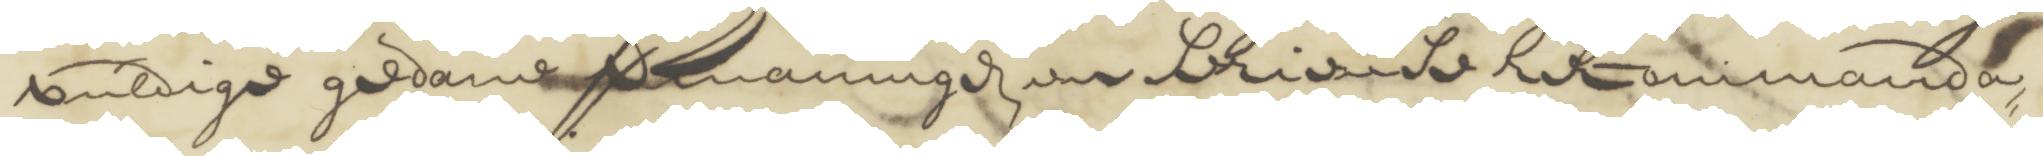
vuldige gedanen vermaningen en serieuse recommanda„
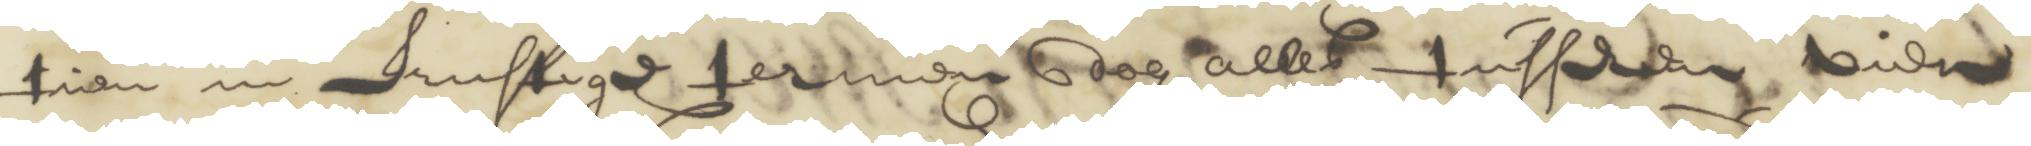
tien in Ernstige ter men dog alles tusschen vier
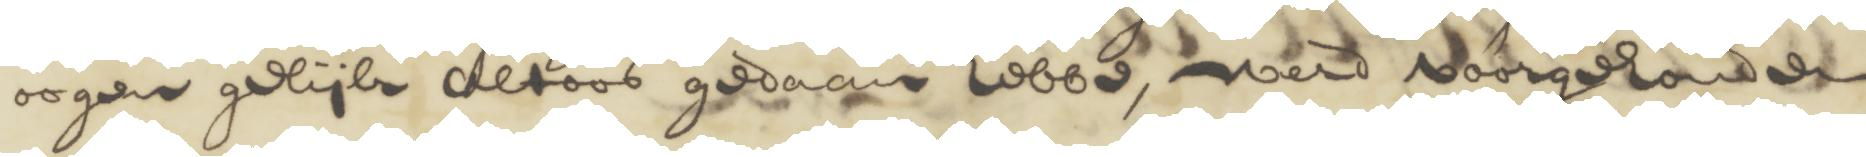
oogen gelijk altoos gedaan hebbe, werd voorgehouden
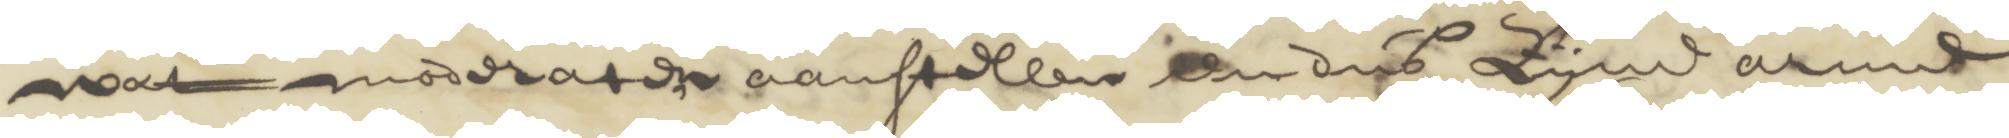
wat moderater aanstellen en dus Zijne arme
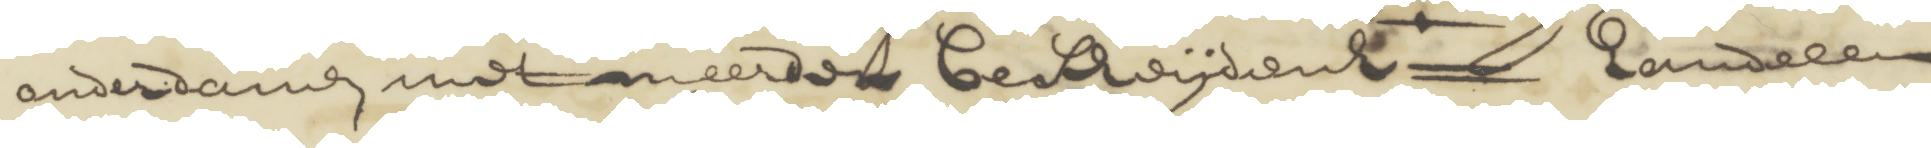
onderdanen met meerden bescheijdenh=t handelen
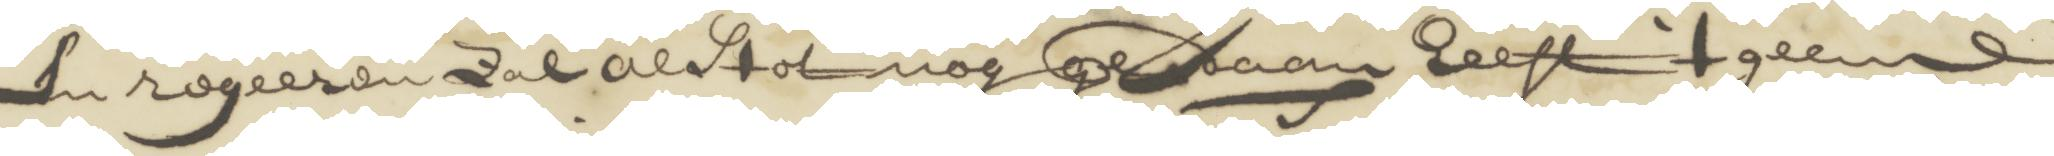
En regeeren zal als tot nog ge daan heeft 't geene
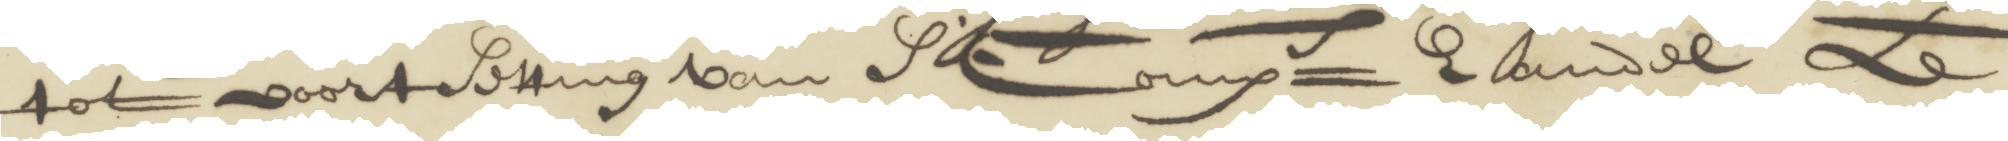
tot voort setting van S' Comp=s handel te
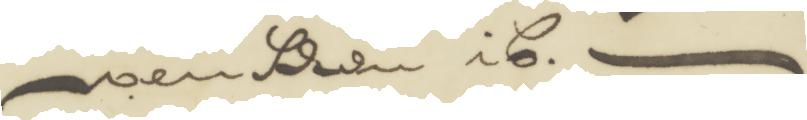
wenschen is.-
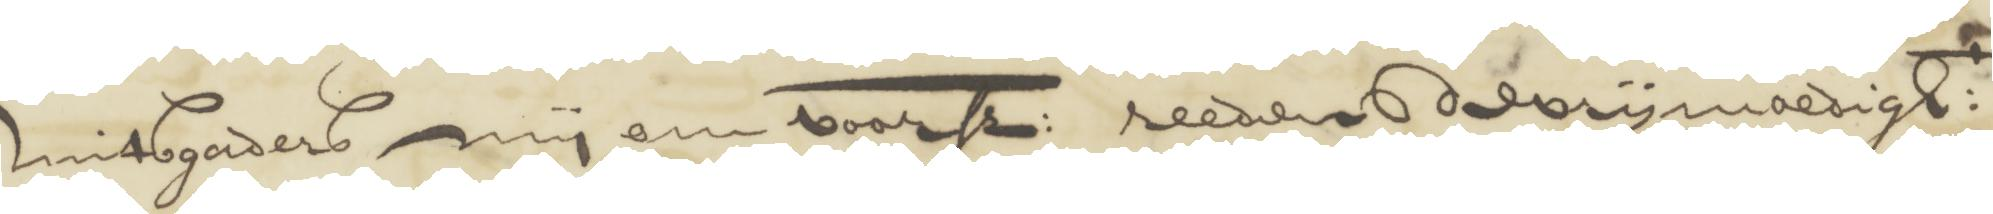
mitsgaders mij om voorsz: reedens de vrij moedigh:t
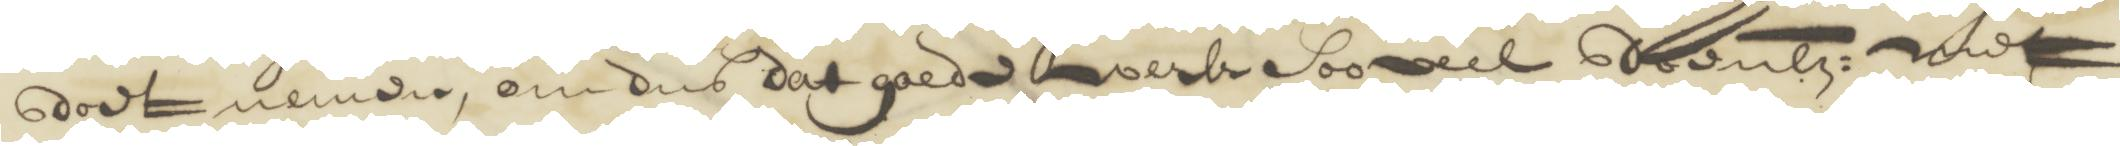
doet nemen, om dus dat goede werk Soo veel doenlijk met
